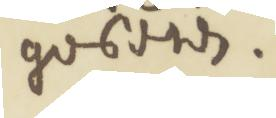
geseten.
